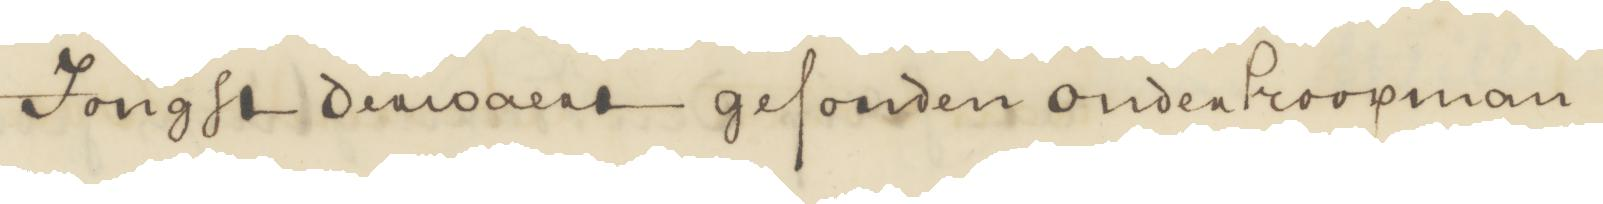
Jongst derwaert gesonden onderkoopman
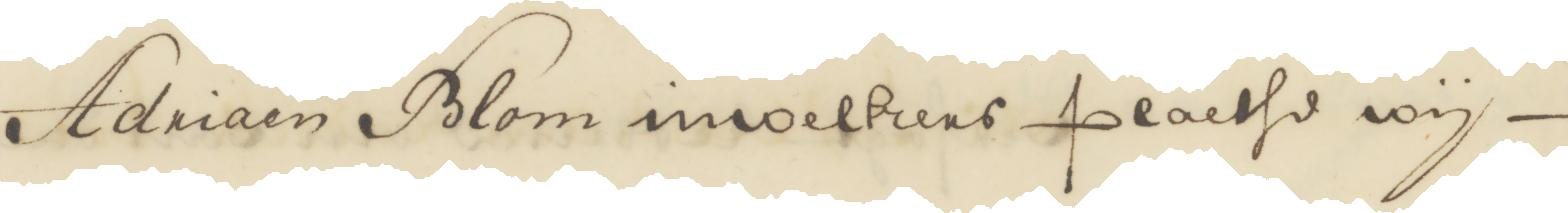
Adriaen Blom inwelkers plaetse wij
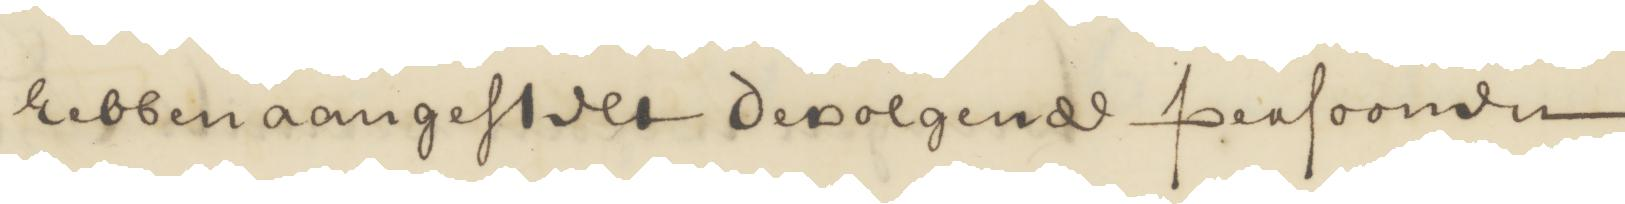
hebben aan gestelt devolgende persoonen
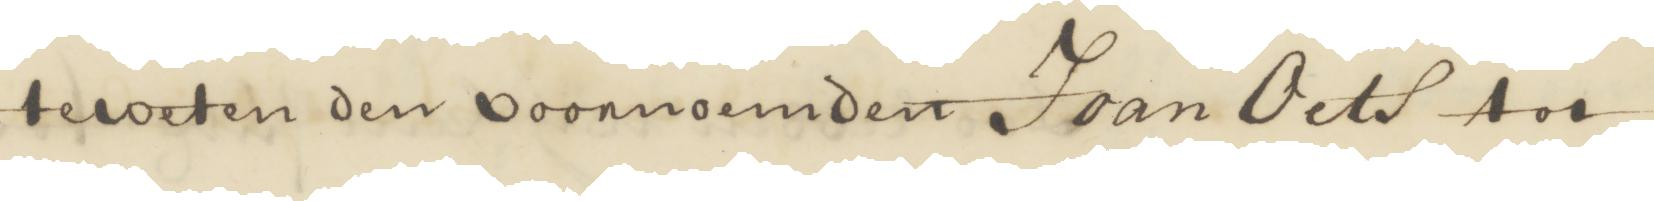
teweten den voornoemden Joan Oets tot
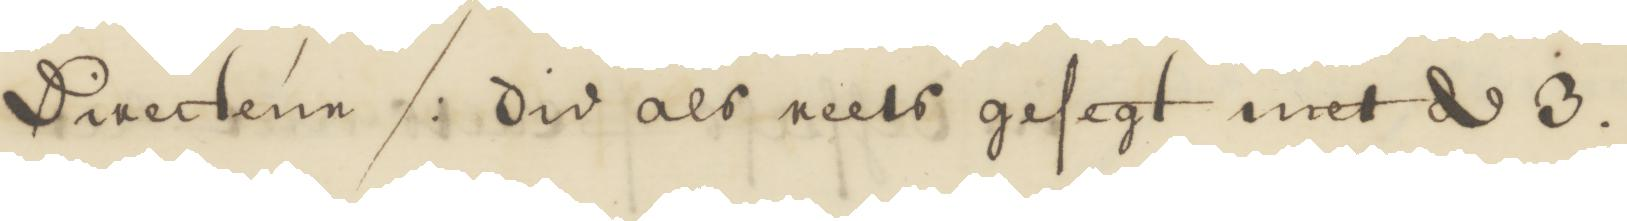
Directeur /:die als reets gesegt met de 3.
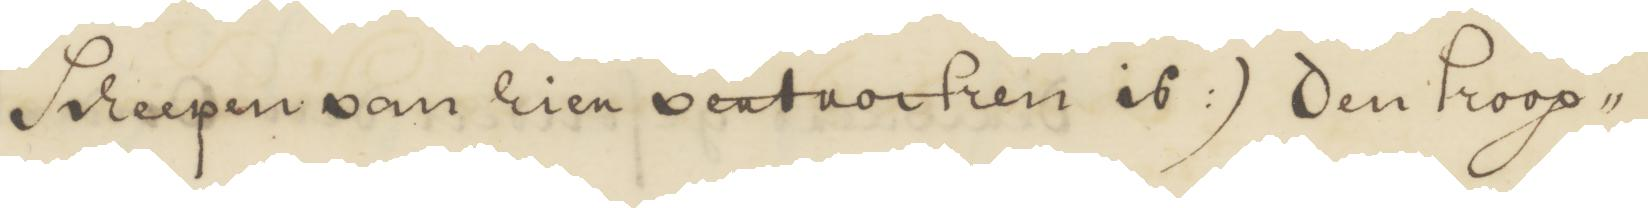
scheepen van hier vertrocken is :) den koop„
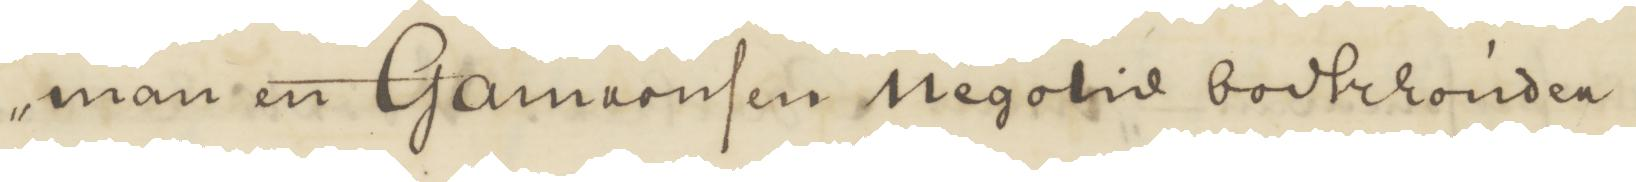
„ man en Gamronsen negotie boekhouder
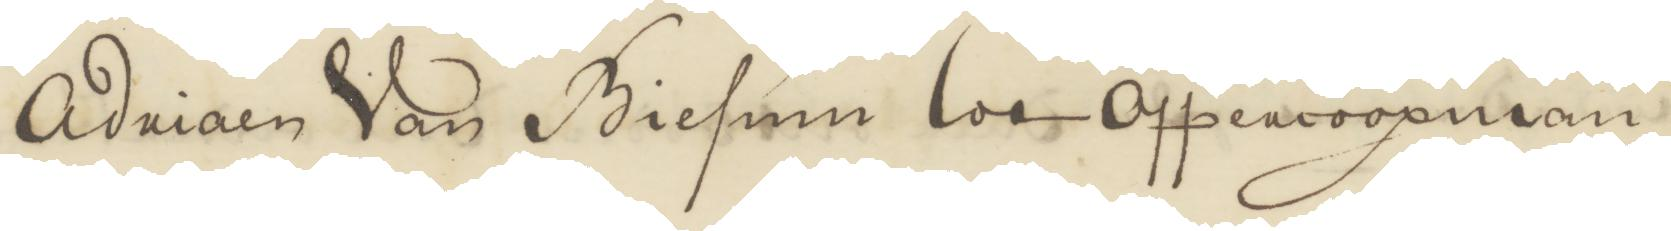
Adriaen Van Biesum tot Oppercoopman
